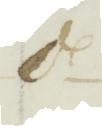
d_o
